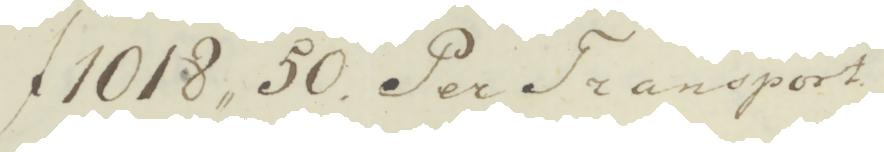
ƒ 1018, 50. Per Transport
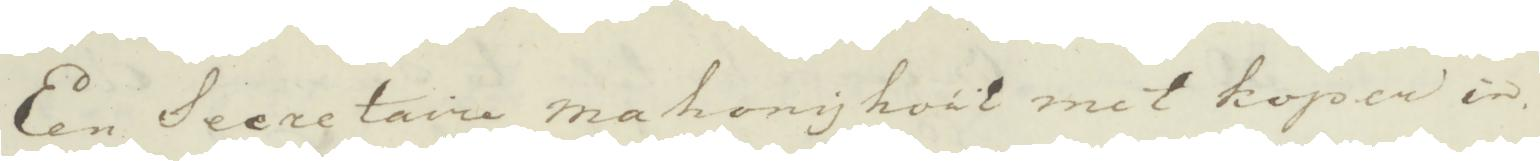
Een Secretaire mahonijhout met koper in
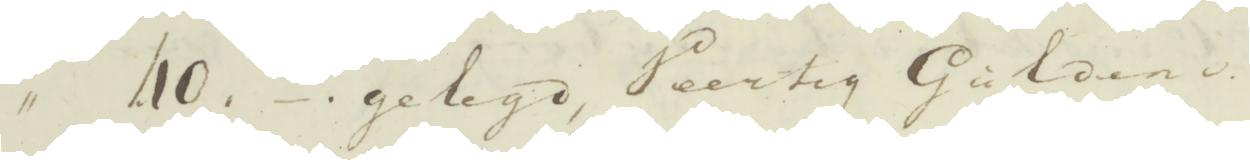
„ 40„ —. gelegd, Veertig Guldens.
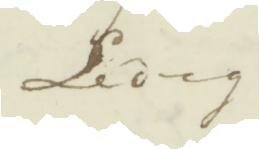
Ledig
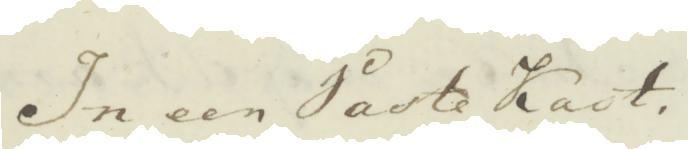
In een Vaste Kast,
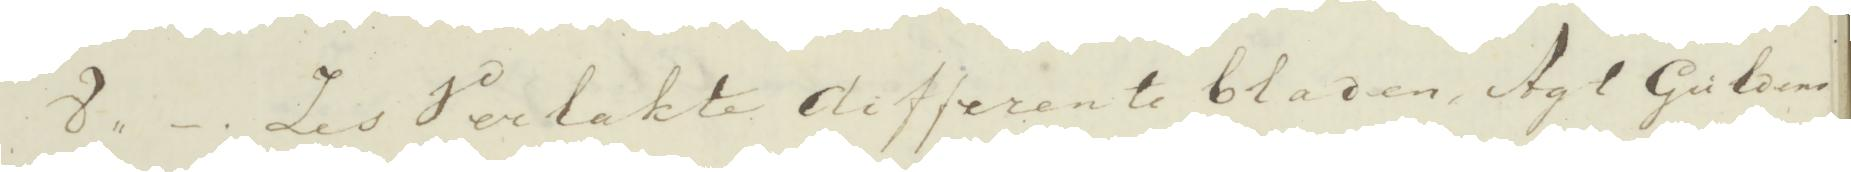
8: —. Zes Verlakte differente bladen, Agt Guldens
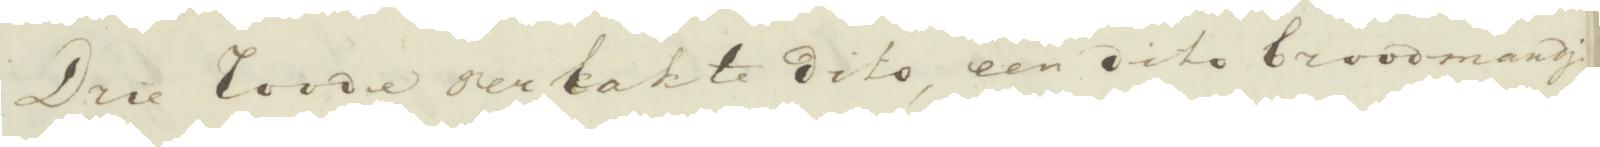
Drie Roode verlakte dito, een dito broodmandje
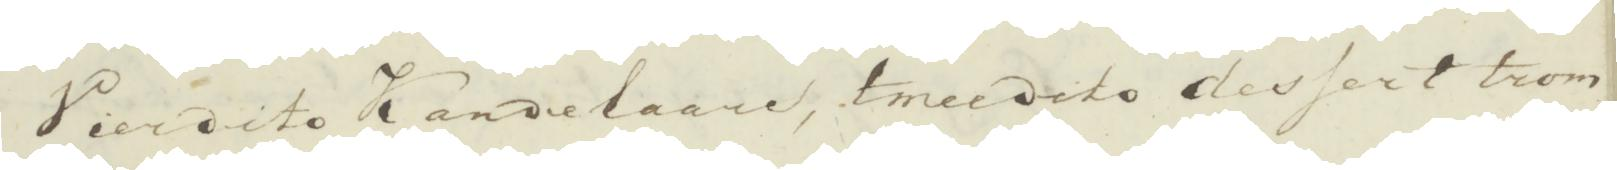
Vier dito Kandelaars, twee dito dessert trom
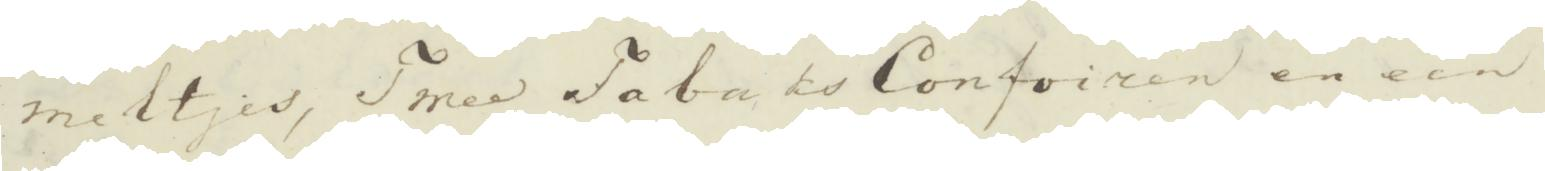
meltjes, Twee Tabaks Confoiren en een
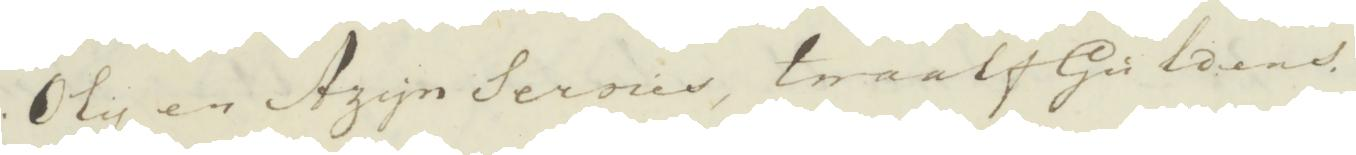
Olij en Azijn Servies, twaalf Guldens.
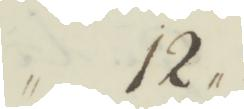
„ 12„
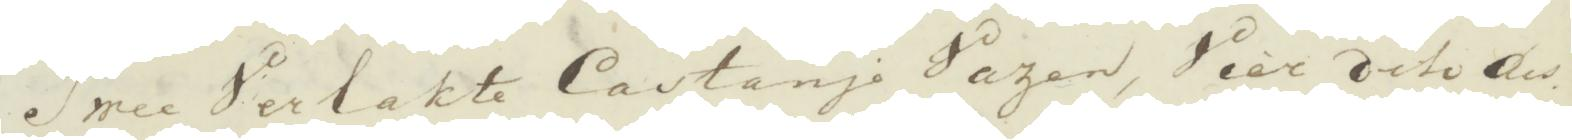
Twee Verlakte Castanje Vazen, Vier dito dis.
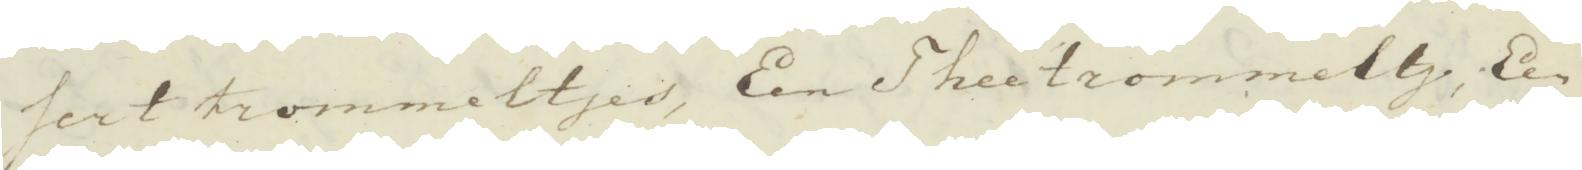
sert trommeltjes, Een Theetrommeltje, Een
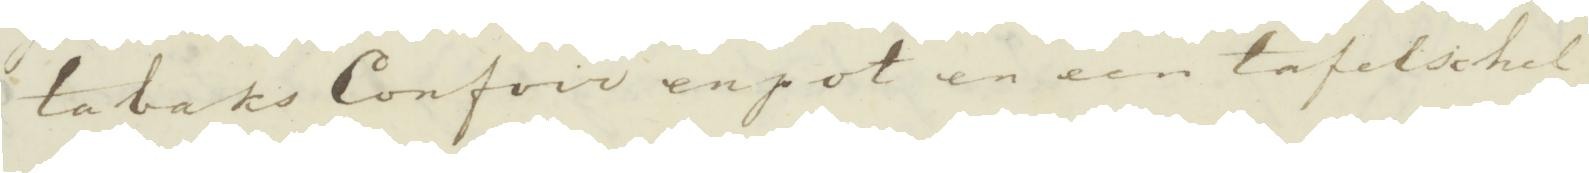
tabaks Confoir en pot en een tafelschel
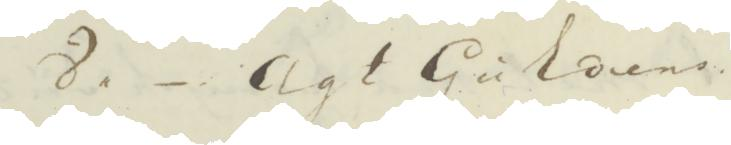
8: —. Agt Guldens
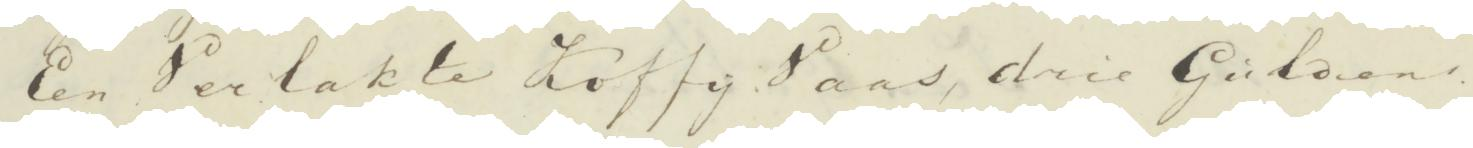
Een Verlakte Koffij Vaas, drie Guldens
